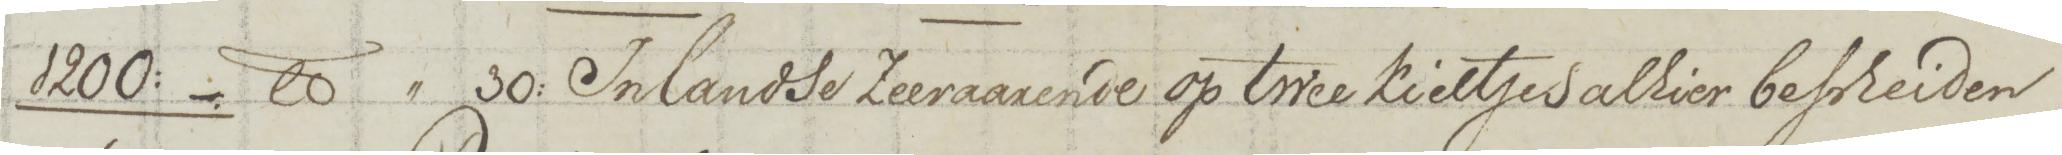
1200: —. lb „ 30: Inlandse zeevaarende op twee kieltjes alhier bescheiden
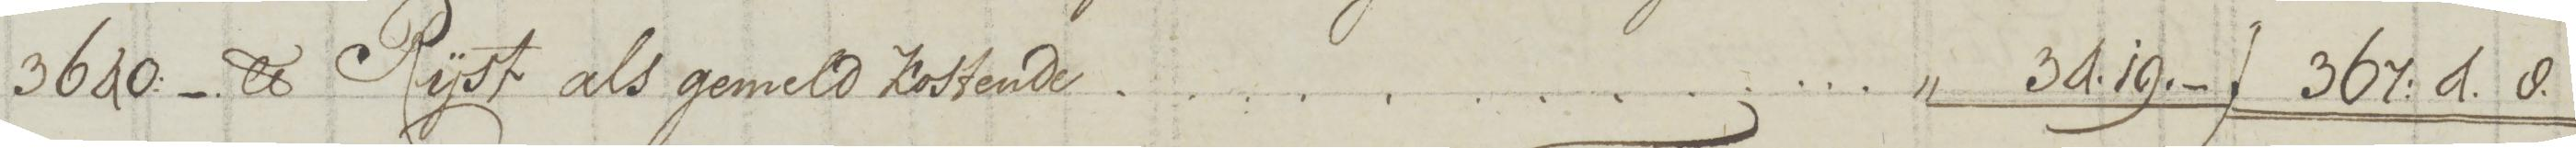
3640: —. lb Rijst als gemeld kostende - - - - - - - - - - - - - „ 34. 19. — ƒ 367: 4. 8.
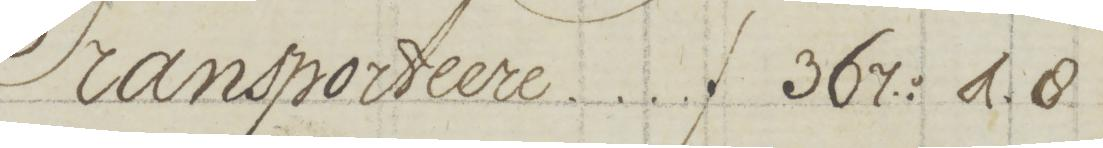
Transporteere - - - - ƒ 367.: 4. 8
